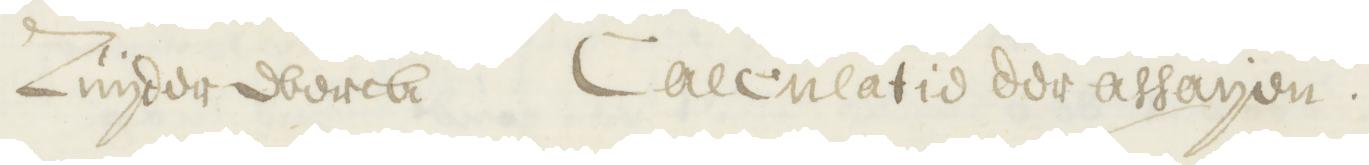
Zuijder werck Calculatie der assaijen .
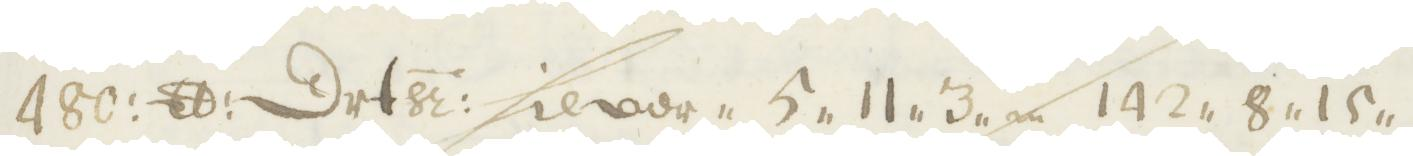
480: lb: Ertsz: Silver „ 5„ 11„ 3„ ƒ 142„ 8„15„
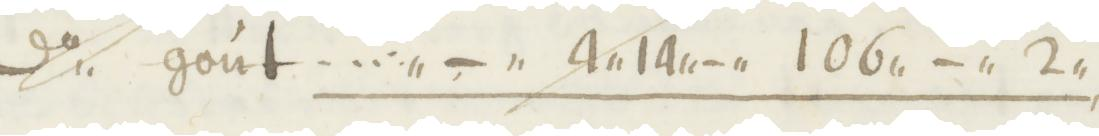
D:o gout . . . . „ - „ 4„14„ - „ 106„ - „ 2„
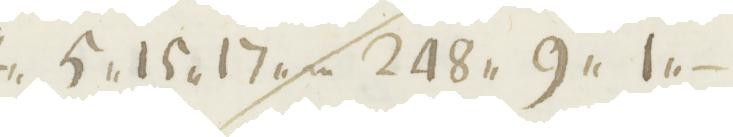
„ 5„15:17: ƒ 248„ 9„ 1„-
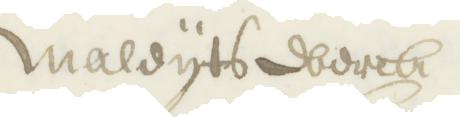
Maleijts werck
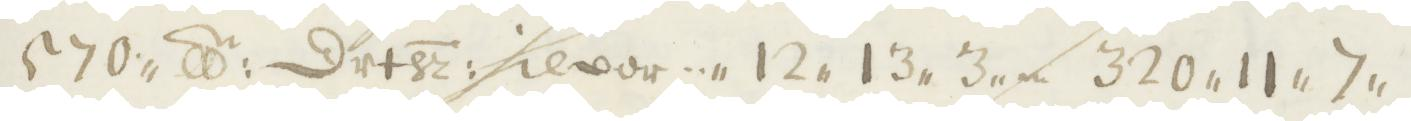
570„ lb:n Ertsz: Silver .. „ 12„ 13„ 3„ ƒ 320„ 11„ 7„
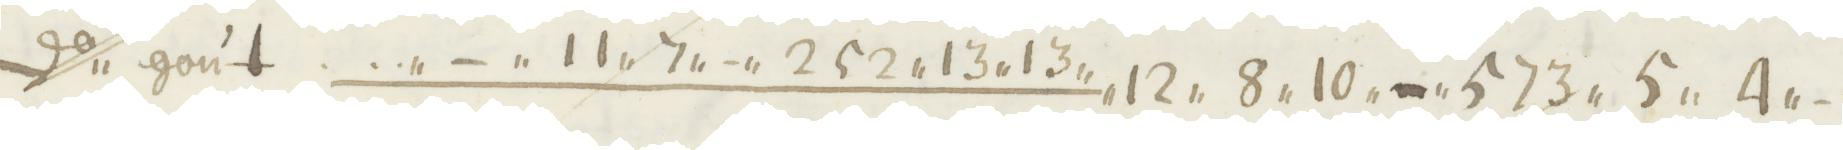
d„o gout. . . „ - „ 11„7„ - „ 252„13„13 „12„ 8„10„-„573„ 5„ 4„-
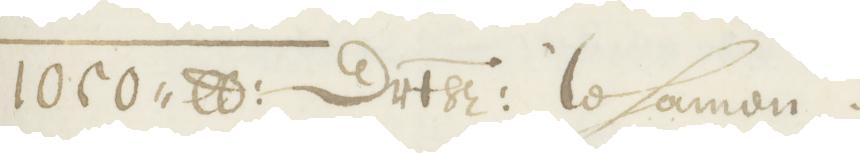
1050„ lb: Ertsz: te samen . . . . . . . . . . . . . .
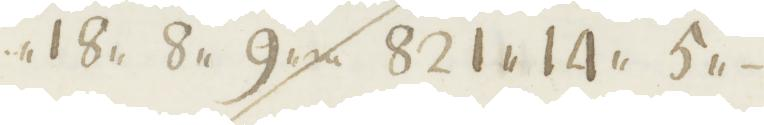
„ 18„ 8„ 9„ƒ 821„ 14„ 5„–
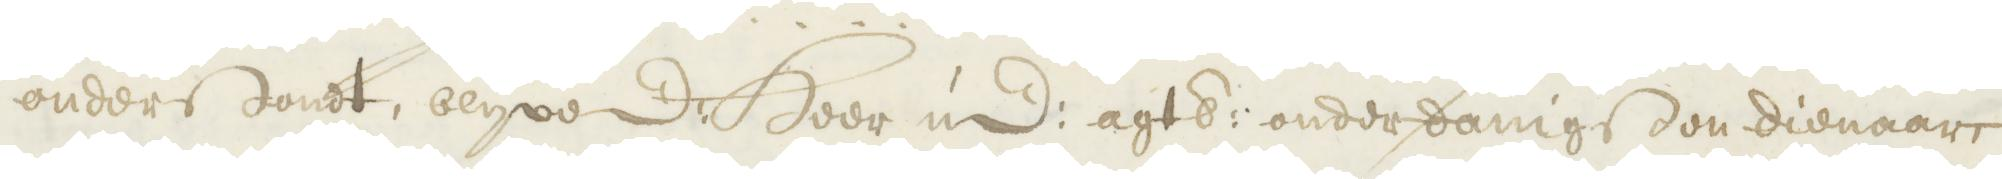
onder stondt, blijve E:Heer u E: agtb: onderdanigsten dienaar,
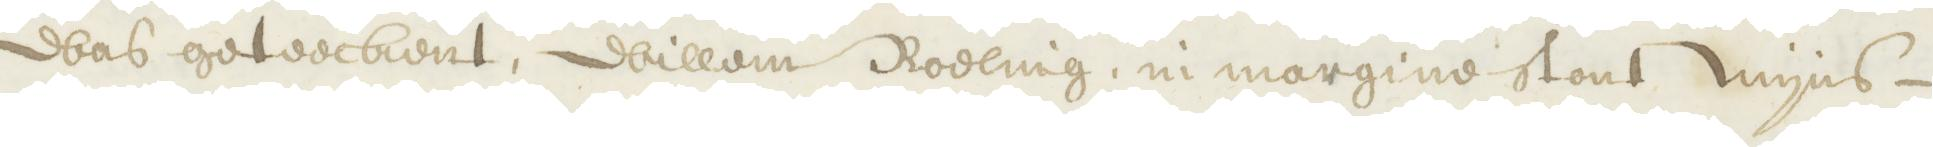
was geteeckent, willem Roeling, in margine stont mijns
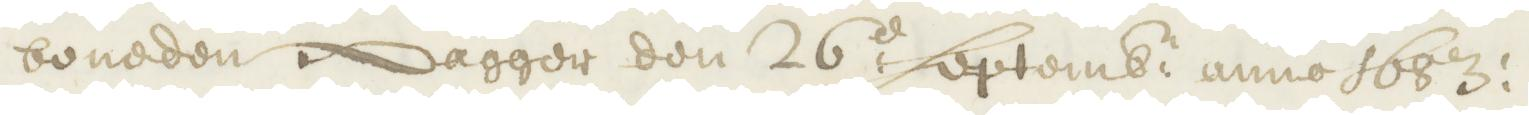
beneden pagger den 26:e Septemb:r anno 1683:
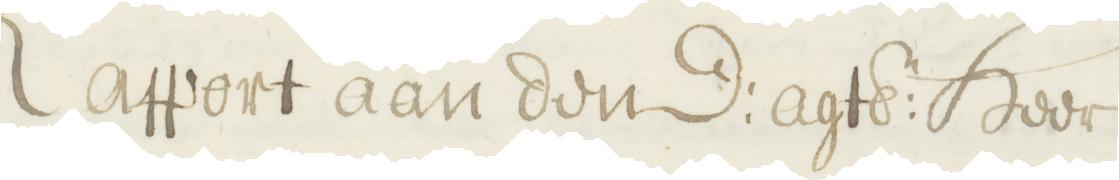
Rapport aan den E: agtb: Heer
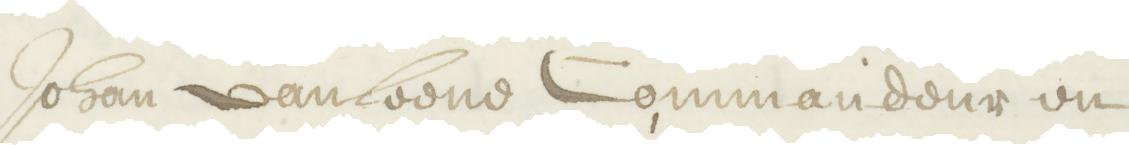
Johan van leene Commandeur en
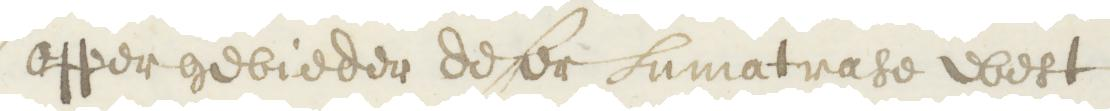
oppergebieden deser Sumatrase west
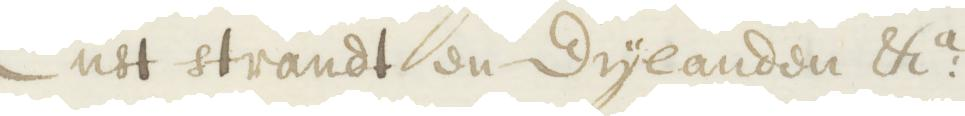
Cust strandt en Eijlanden &:a
